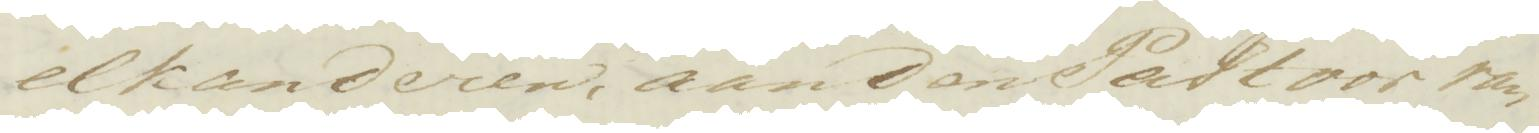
elkanderen, aan den Pastoor van
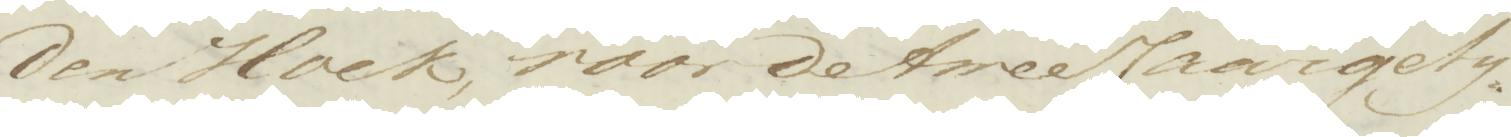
den Hoek, voor de twee Jaargetij„
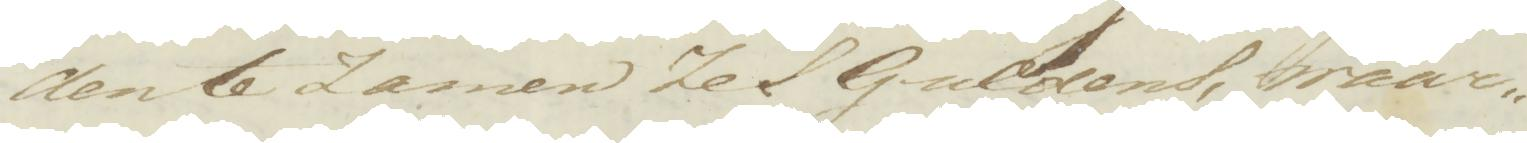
den te Zamen Zes Guldens, waar„
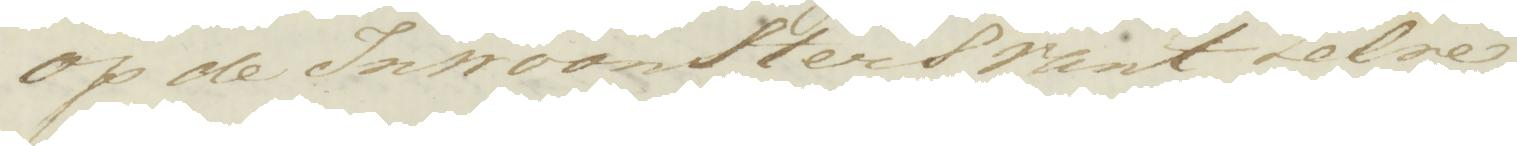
op de Inwoonsters van 't Zelve
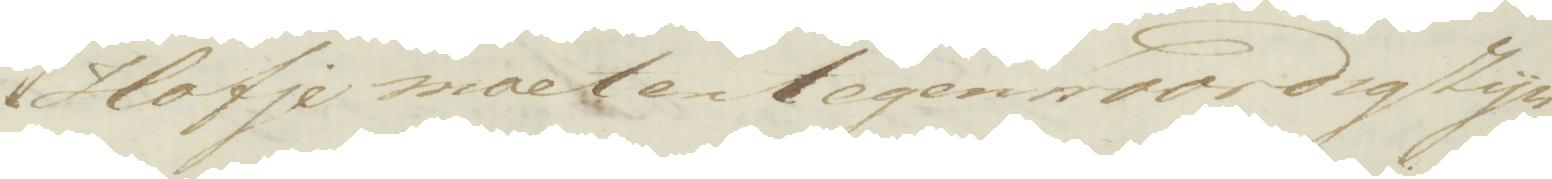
Hofje moeten tegenwoordig Zijn,
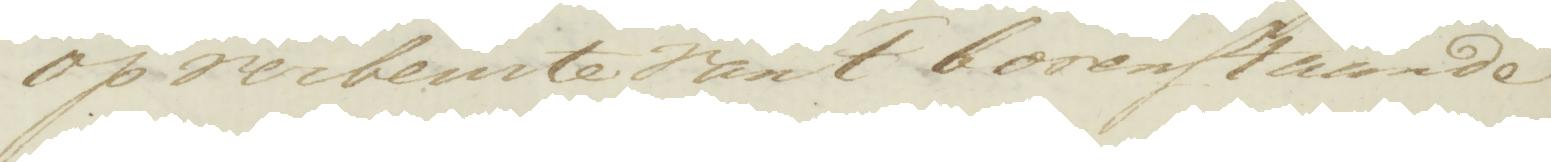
op verbeurte van ’t bovenstaande
